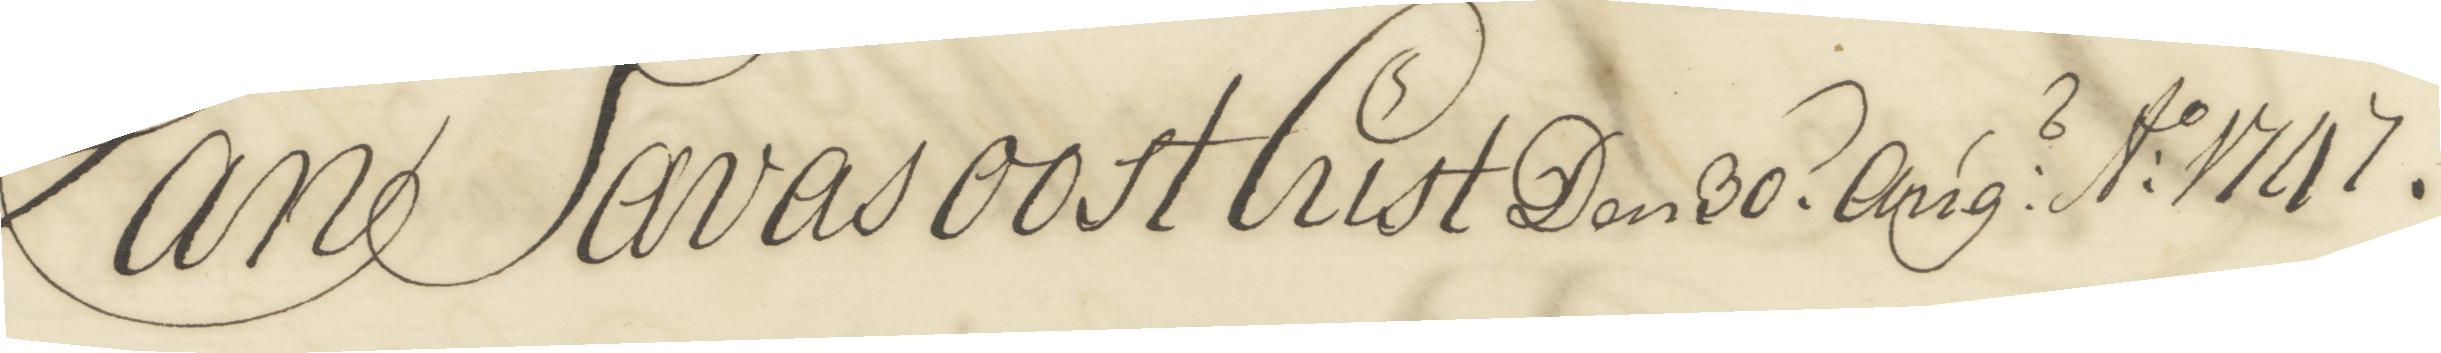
Van Javas oost Cust Den 30.' Aug:s A:o 1747.
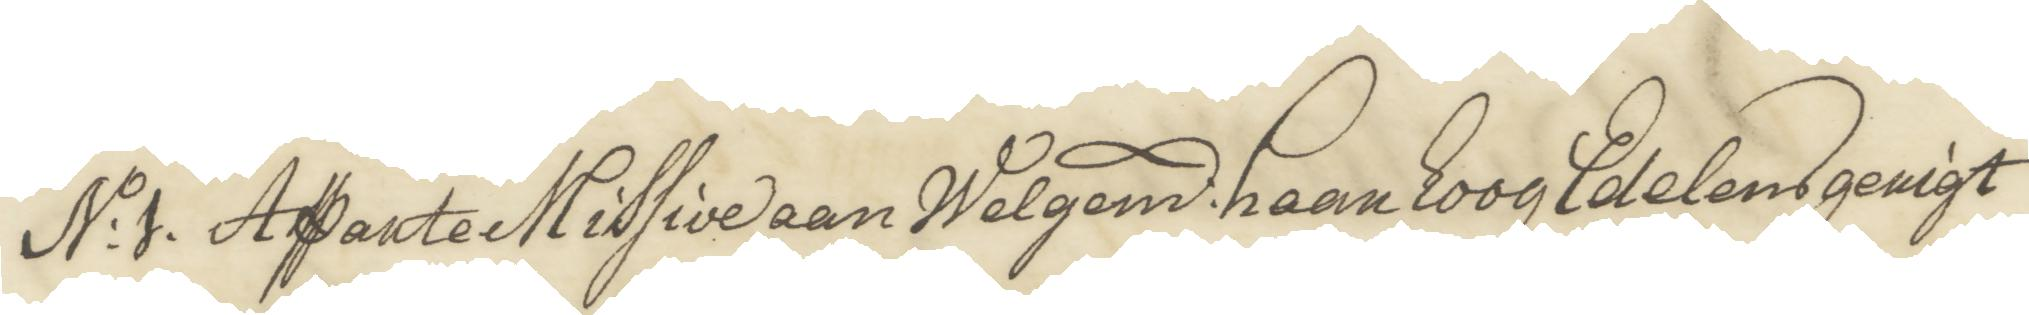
N:o 1. Apparte Missive aan Welgem: haar hoog Edelens gerigt
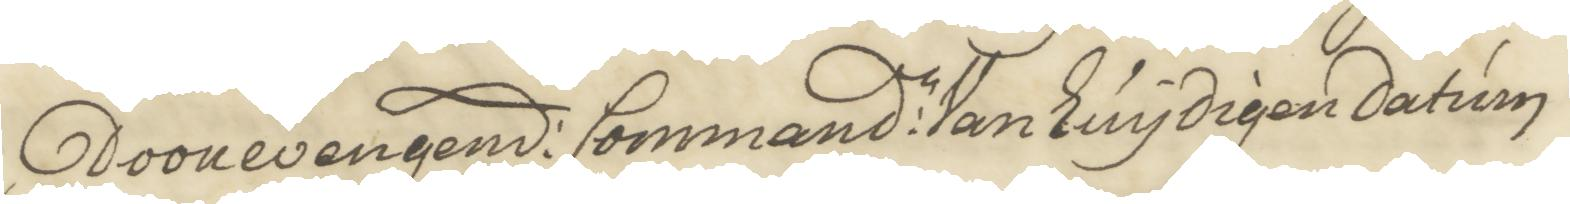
doorevengem: Command:r van huijdigen datum
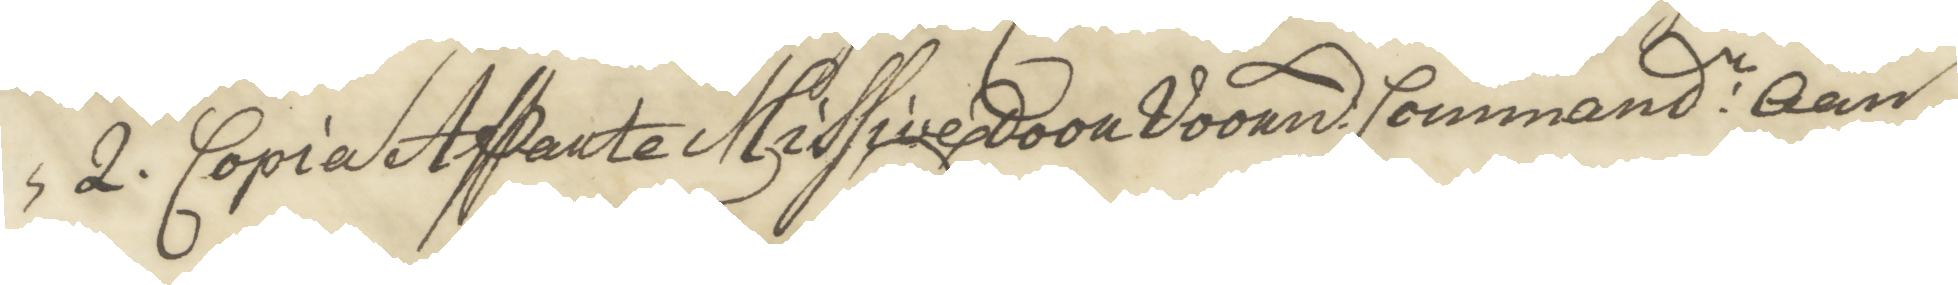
„ 2. Copia Apparte Missive door voorn: Command:r aan
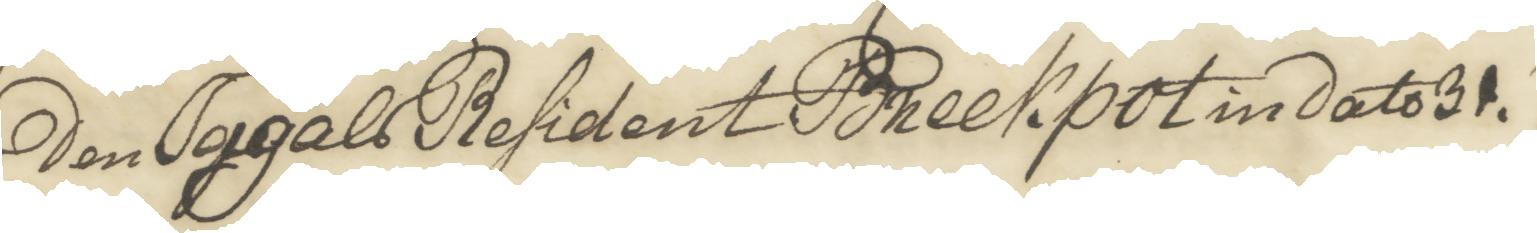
den Tagals Resident Breekpot in dato 31.
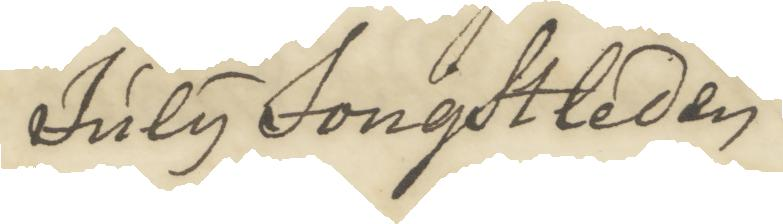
Julij Jongstleden
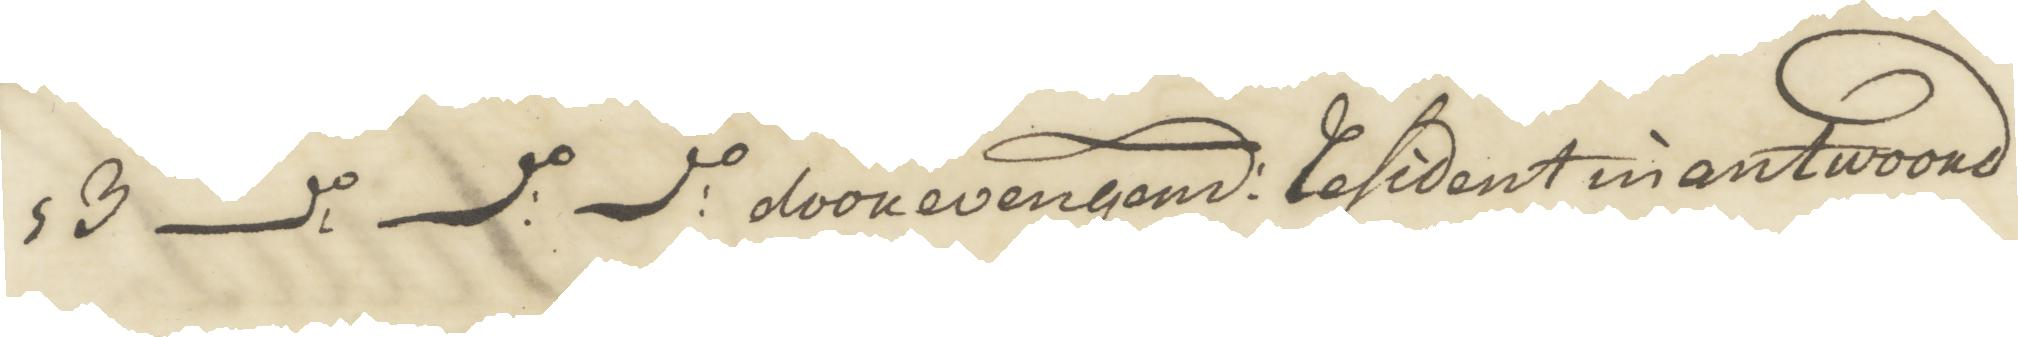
„ 3 _:o _:o _:o door evengem: resident in antwoord
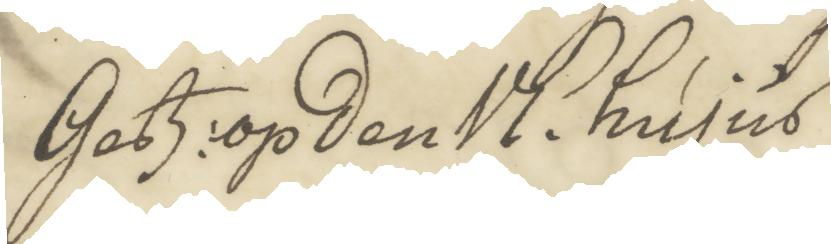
Gesz: op den 17. huijus
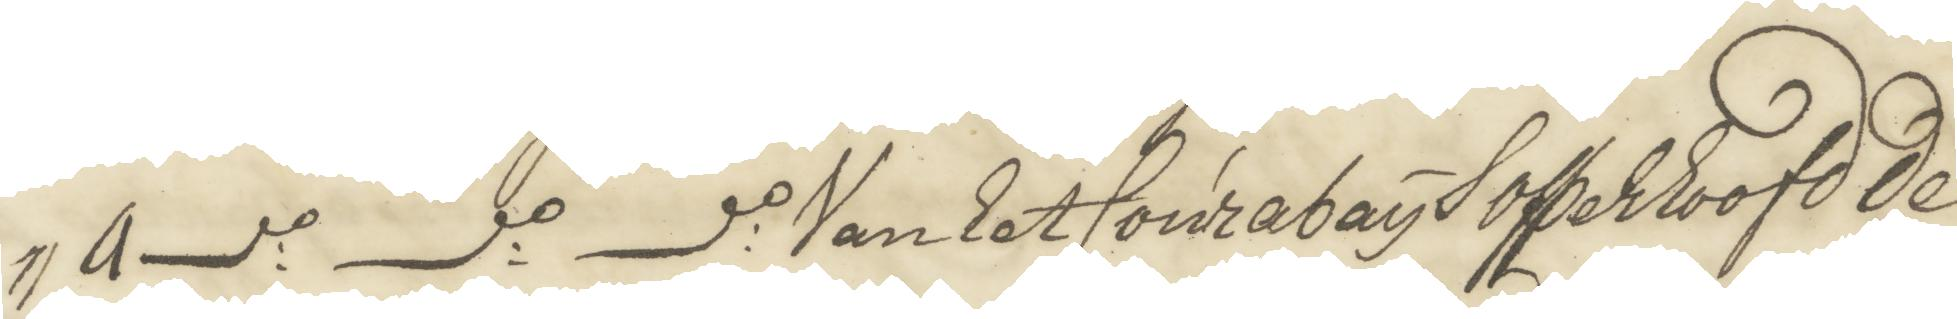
„ 4 _:o _:o _:o Van het sourabaijs opperhoofd de
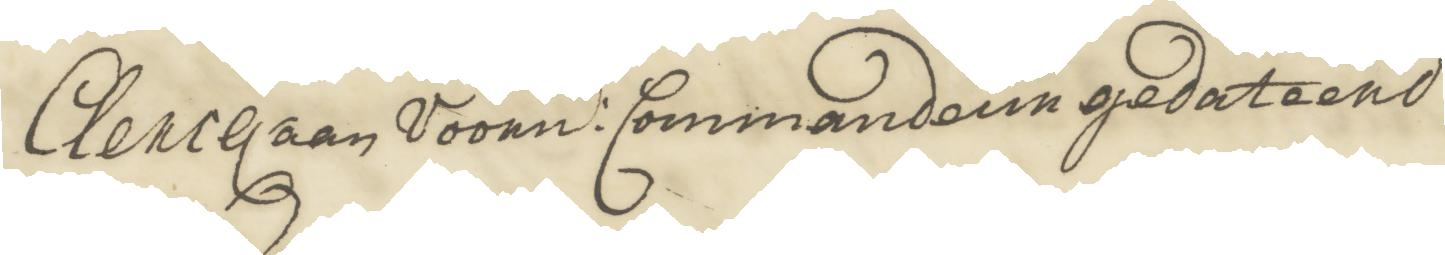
Clercq aan voorn: Commandeur gedateerd
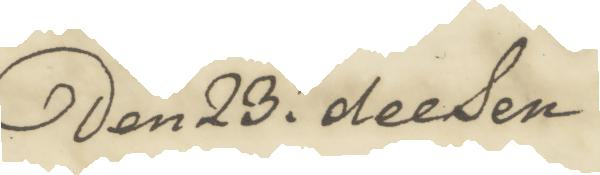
den 23.' deesen
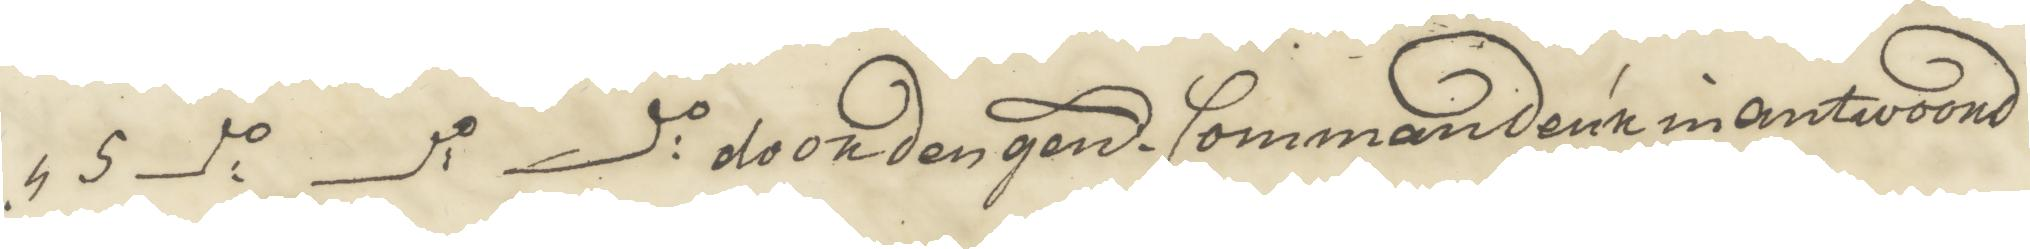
„ 5 _:o _:o _:o door den gen. Commandeur in antwoord
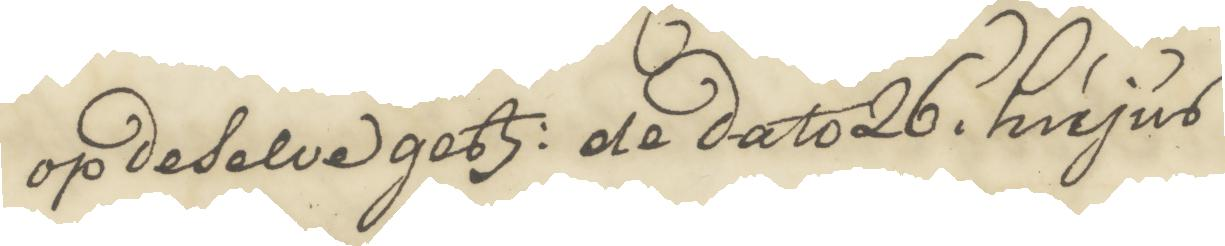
op deselve gesz: de dato 26.' hujus
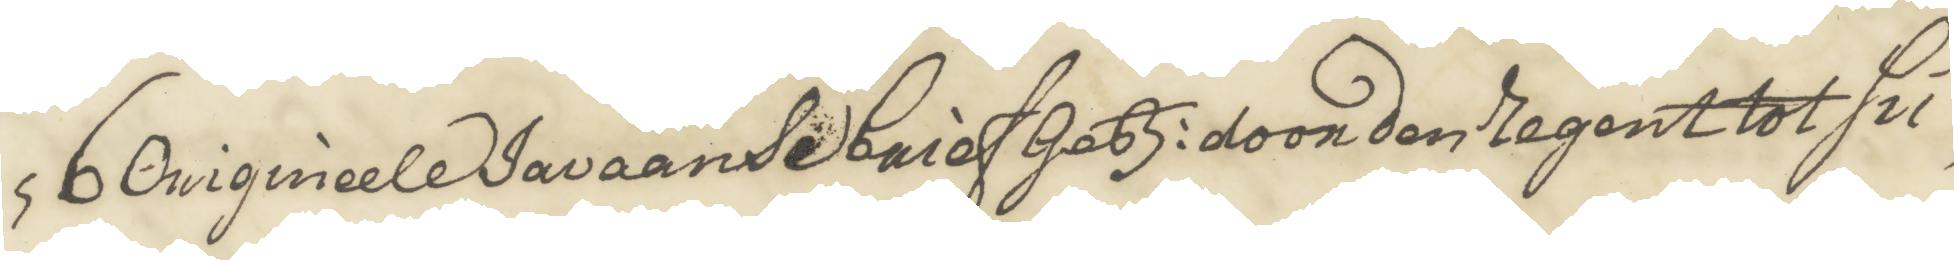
„ 6 Origineele Javaanse brief gesz: door den regent tot su
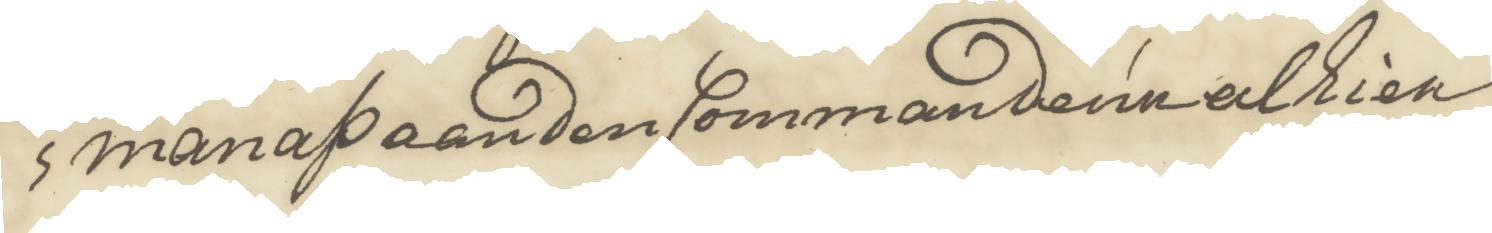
„manap aan den Commandeur alhier
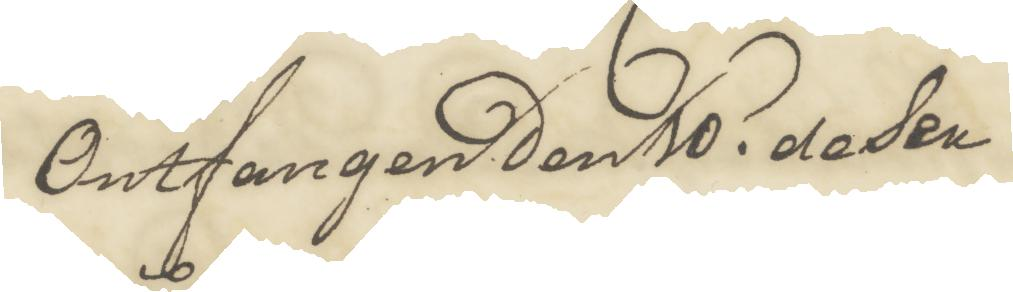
Ontfangen den 10.' deser
